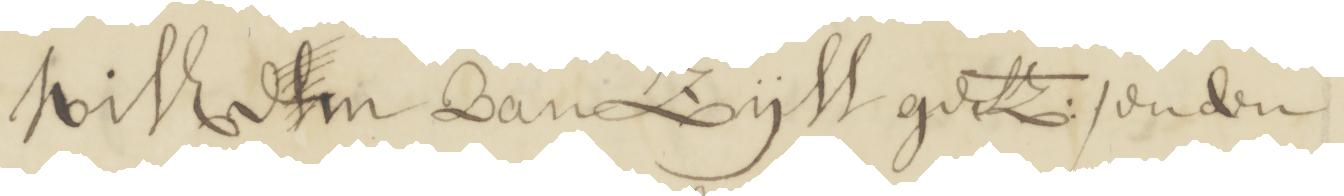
wilhelm van zijll gesz:/ en den
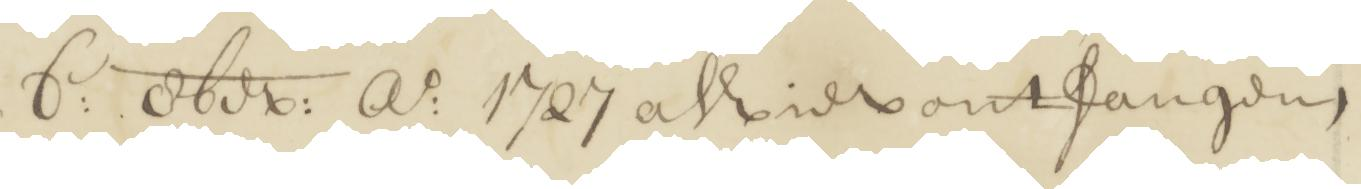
6:' 8ber: a:o 1727 alhier ontfangen,
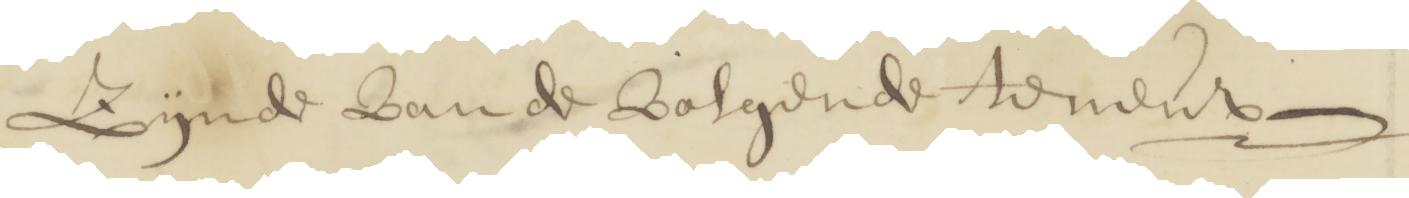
zijnde van de volgende teneur —
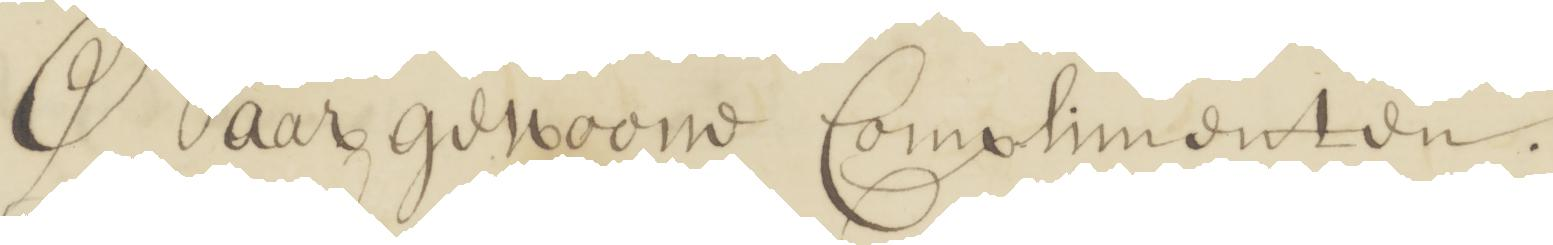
Naar gewoone Complimenten.
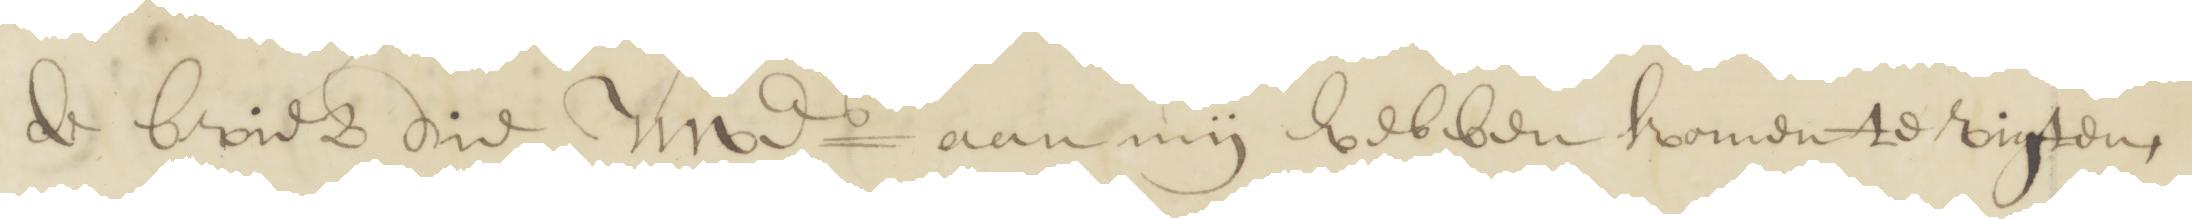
de briev die uwE=s aan mij hebben komen te rigten,
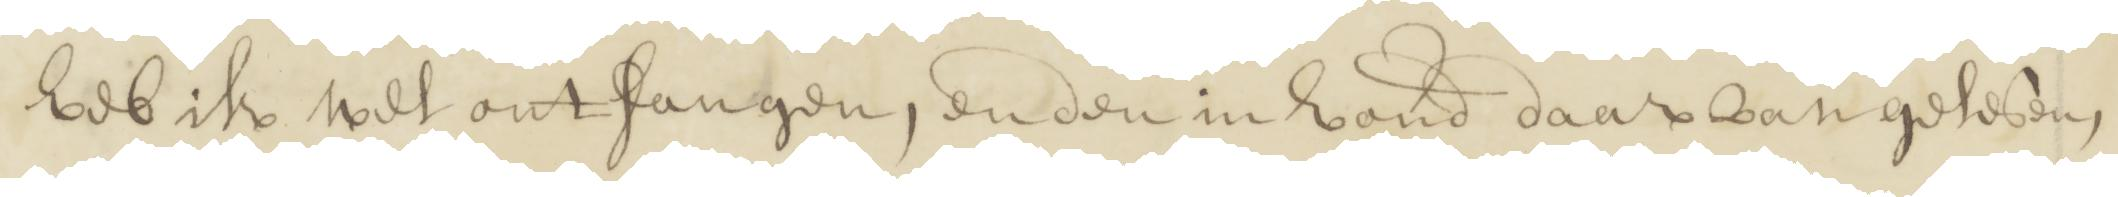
heb ik wel ontfangen, en den in houd daar van gelesen,
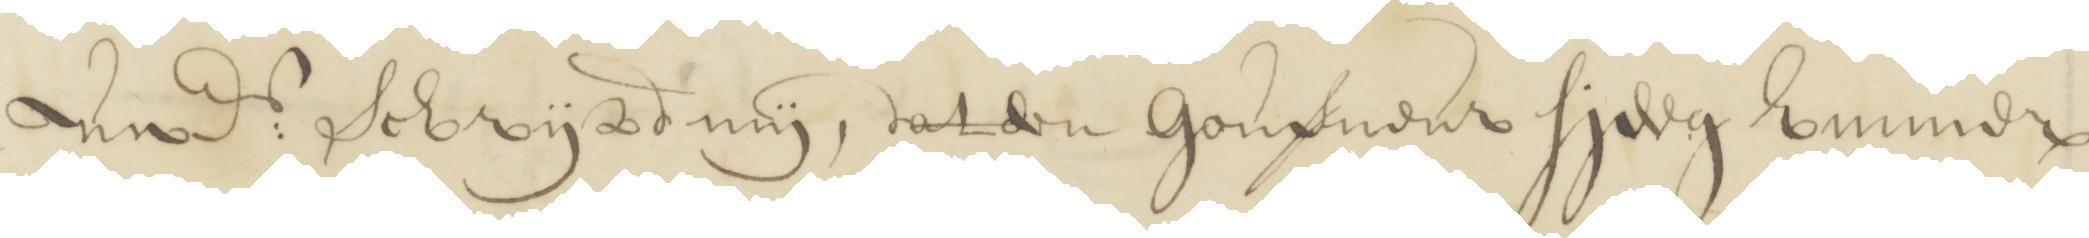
uwE:s schrijvd mij, dat den gouverneur sjeeg hmmer
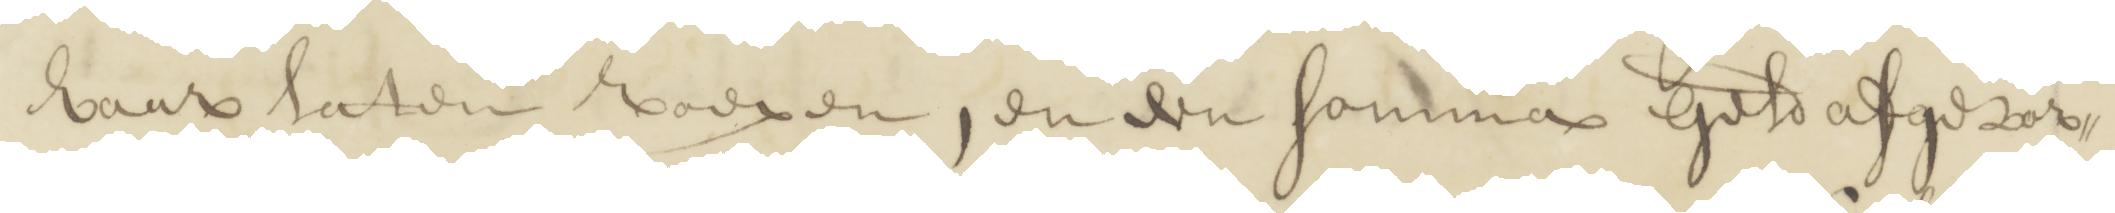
haar laten roepen, en een somma geld afgevor„
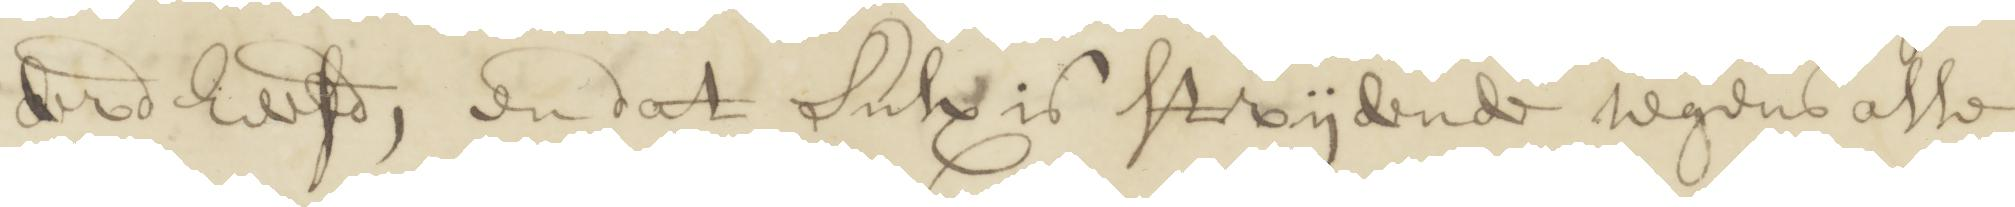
derd heefd, en dat sulx is strijdende tegens alle
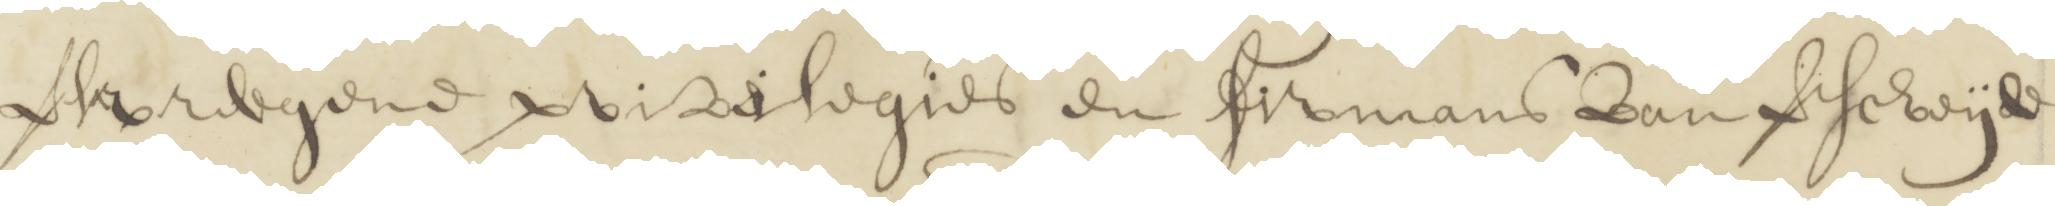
verkreegene privilegies en firmans van verscheijde
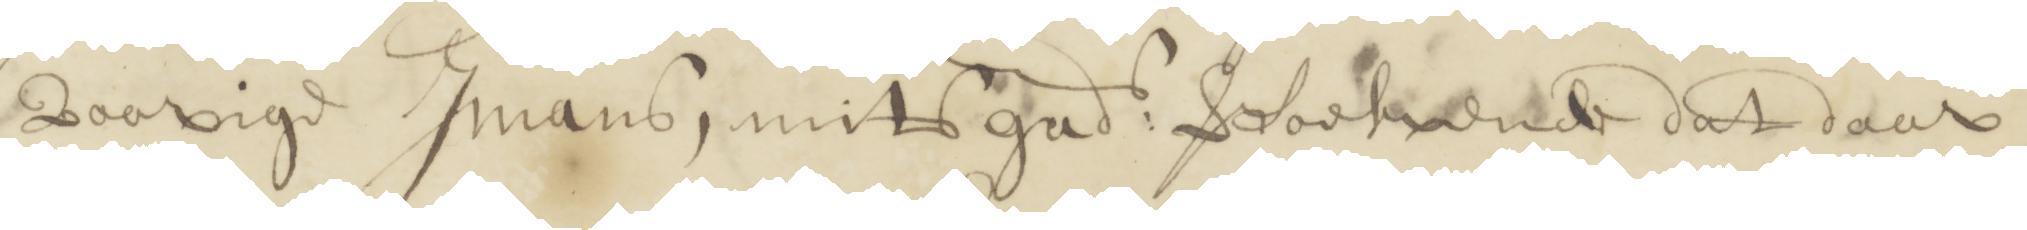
voorige Jmans, mitsgad:s versoekende dat daar
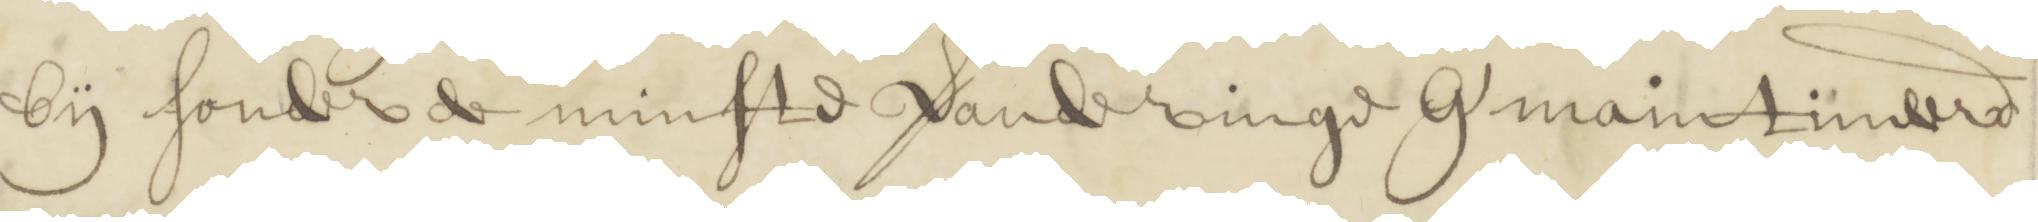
bij sonder de minste veranderinge g’maintineerd
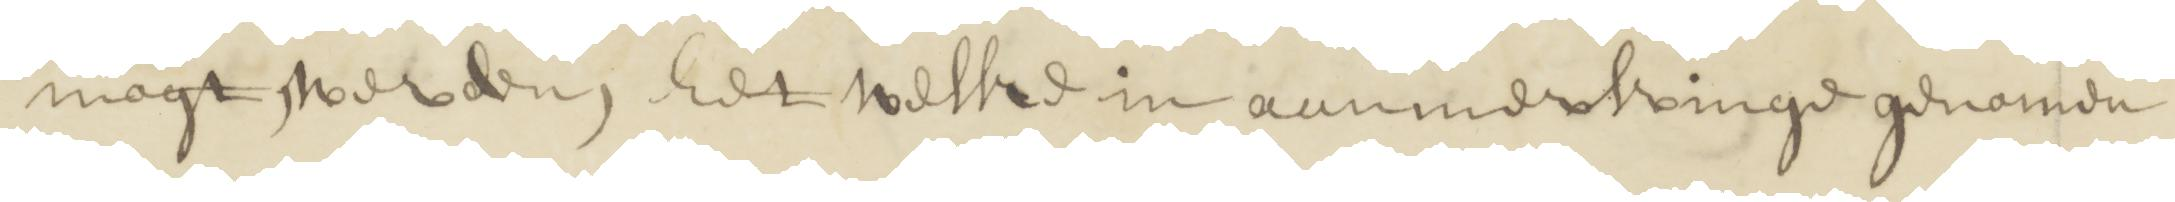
mogt werden, het welke in aanmerkinge genomen
